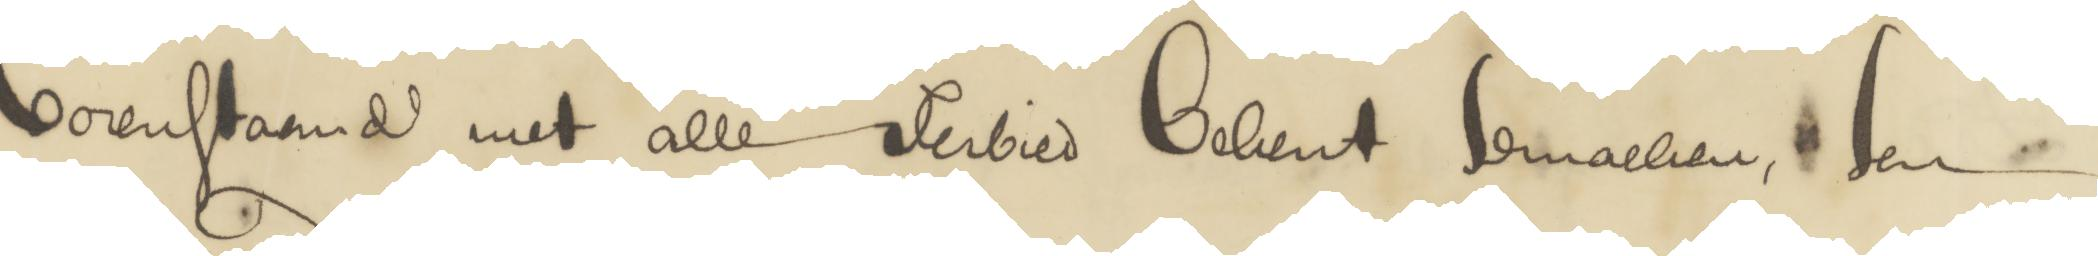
vorenstaande met alle Eerbied bekent temaeken, ten
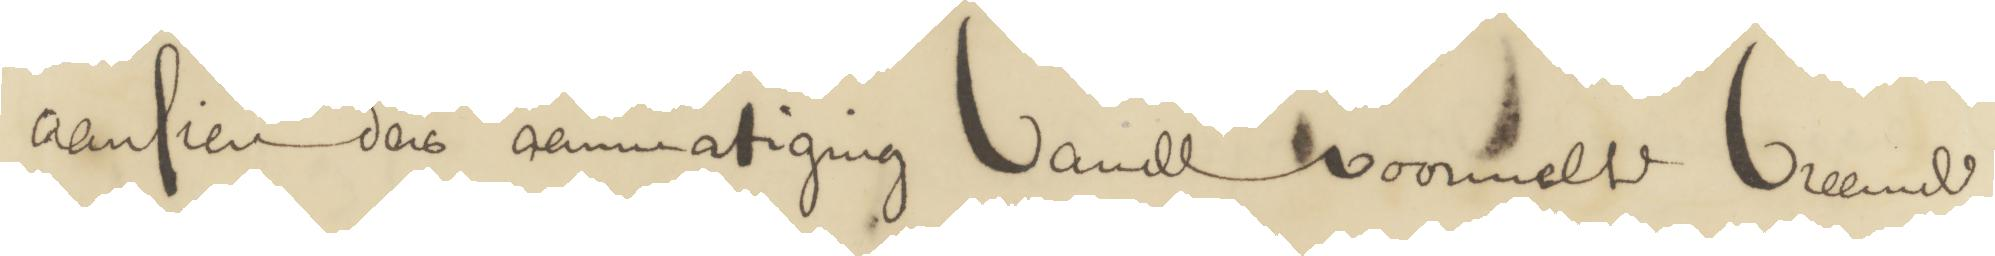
aansien der aanmatiging vande voormelte vreemde
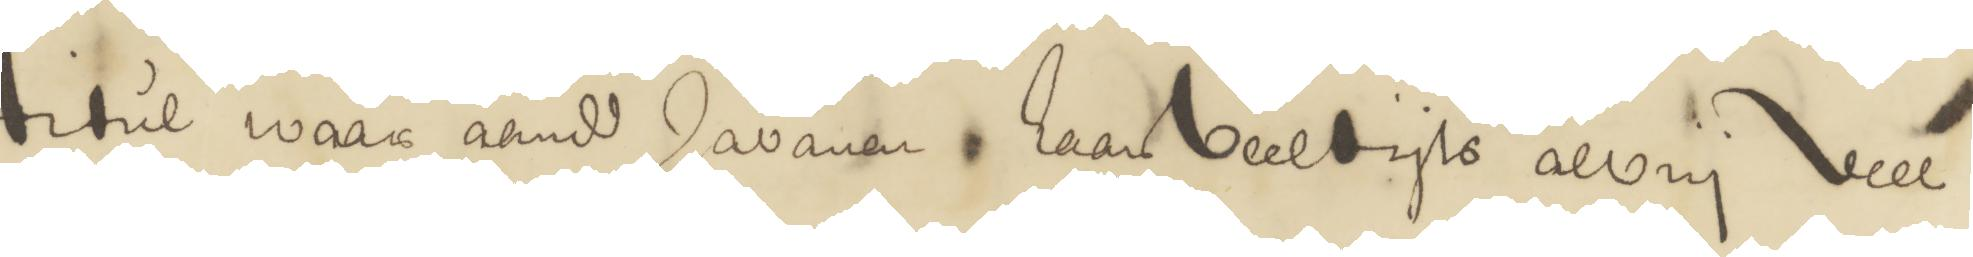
titul waar aande Javanen haar veeltijts alvrij veel
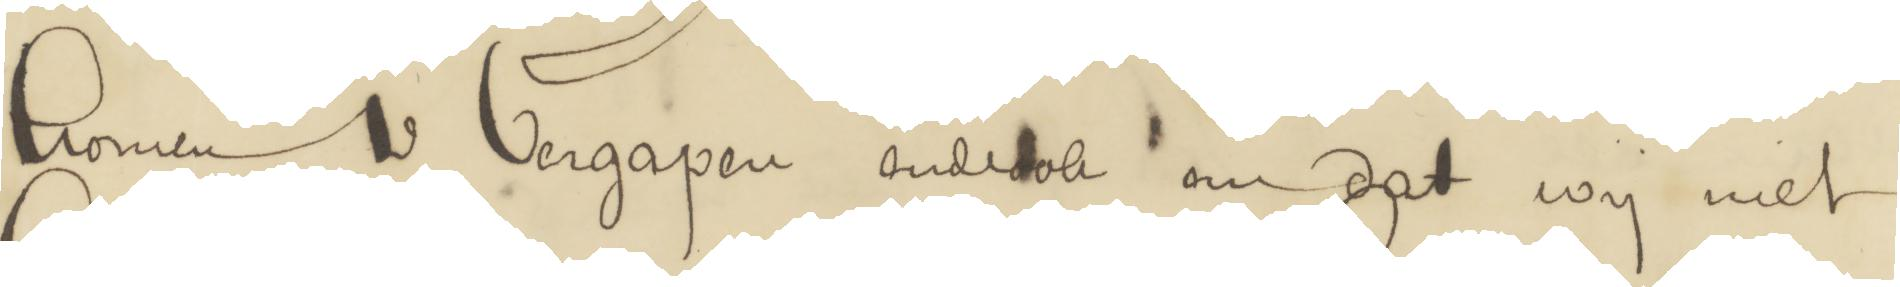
komen te vergapen ende ook om dat wij niet
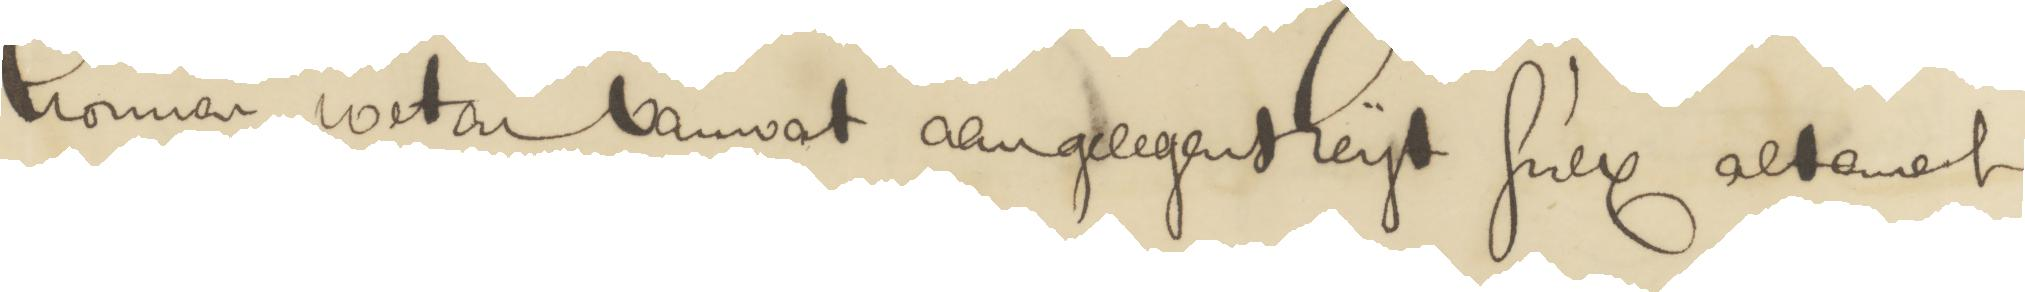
konnen weten van wat aangelegentheijt sulx altewel
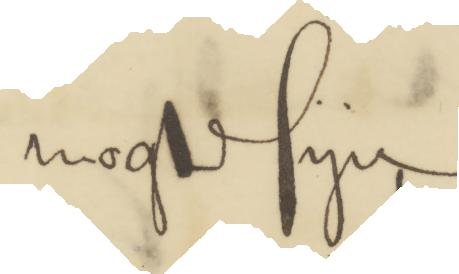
mogte sijn
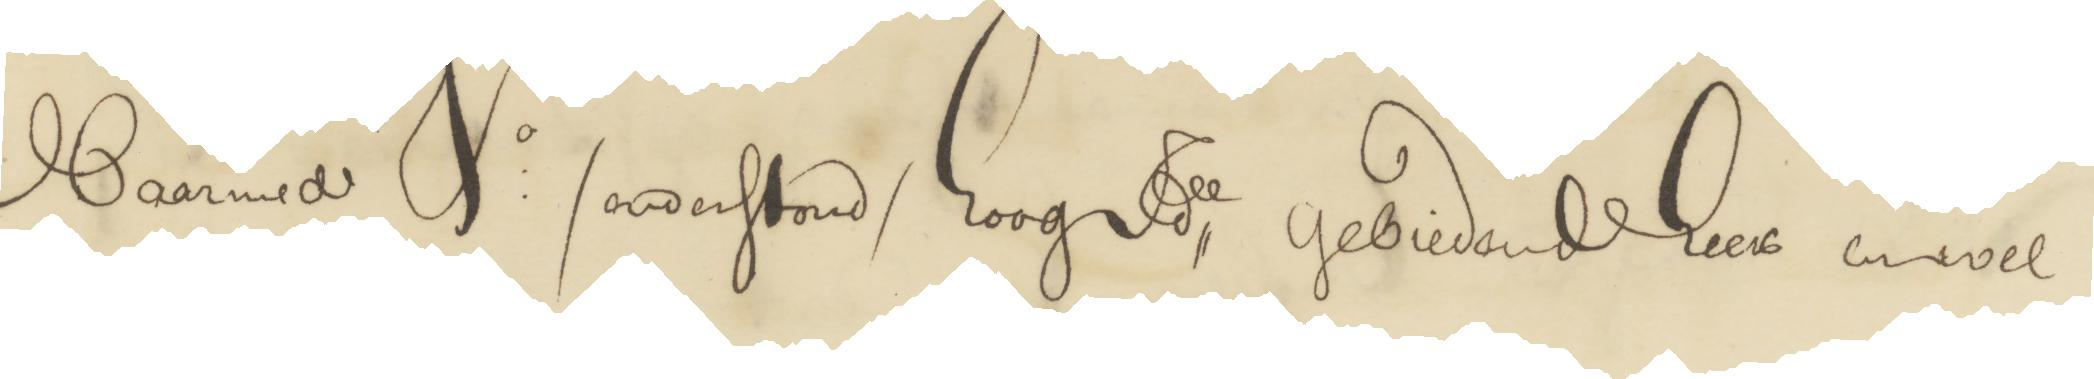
Waar mede &:a /onderstond/ Hoog Ed„le gebiedende Heer en wel
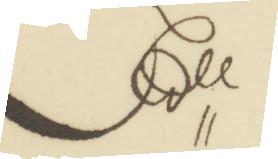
Ed„le
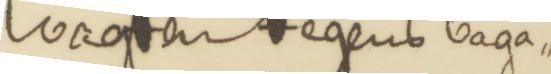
wagten tegens vaga„
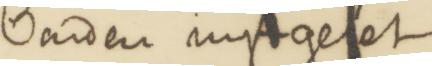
bonden uijtgeset
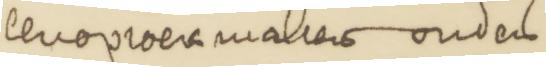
een oproermaker onder
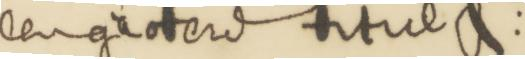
een grotere titul &:a
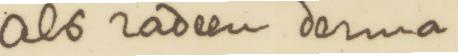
als radeen derma
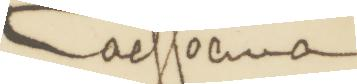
Coessoema
